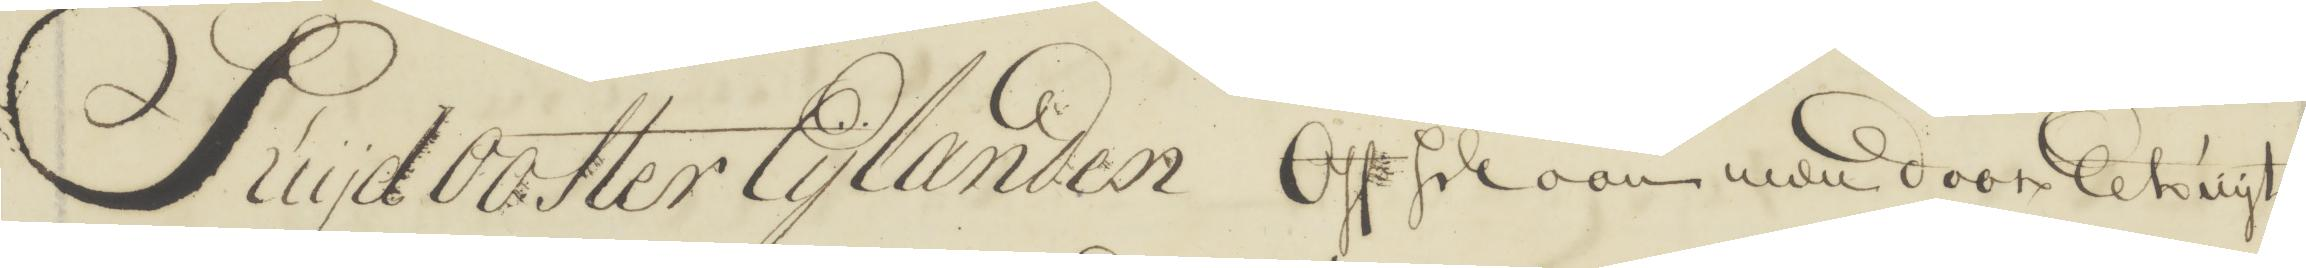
Suijd Ooster Eijlanden Offschoon men door het uijt
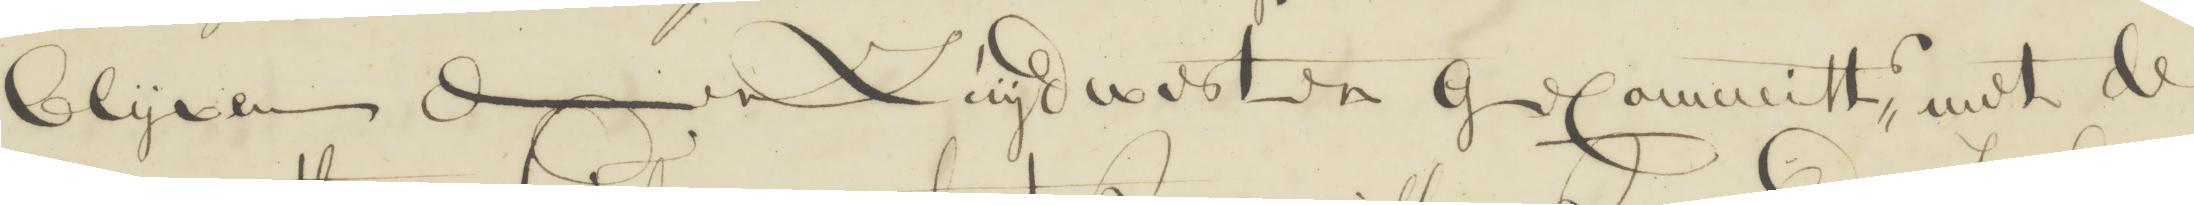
blijven der Zuijdwester gecommitt„s met de
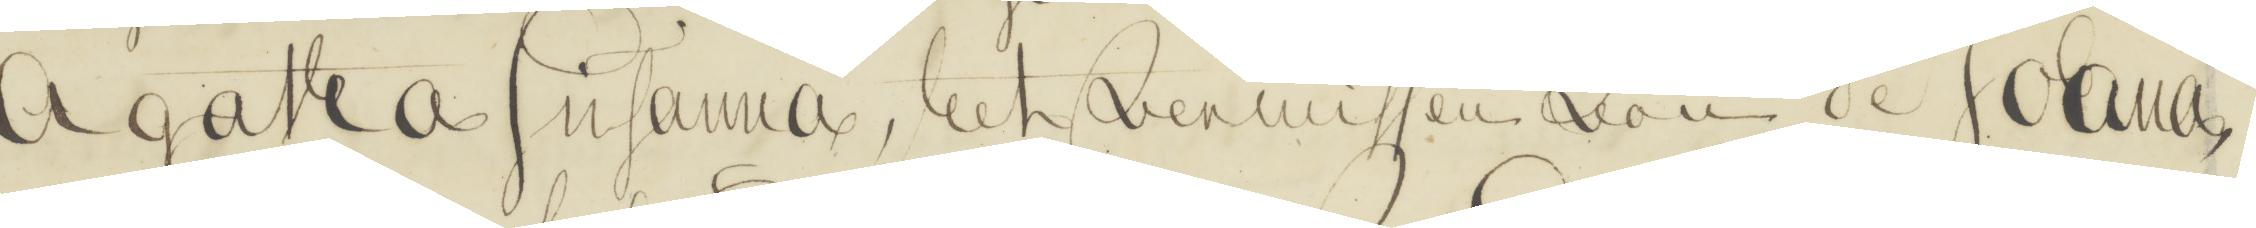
Agatha Susanna, het vermissen van de Ioana
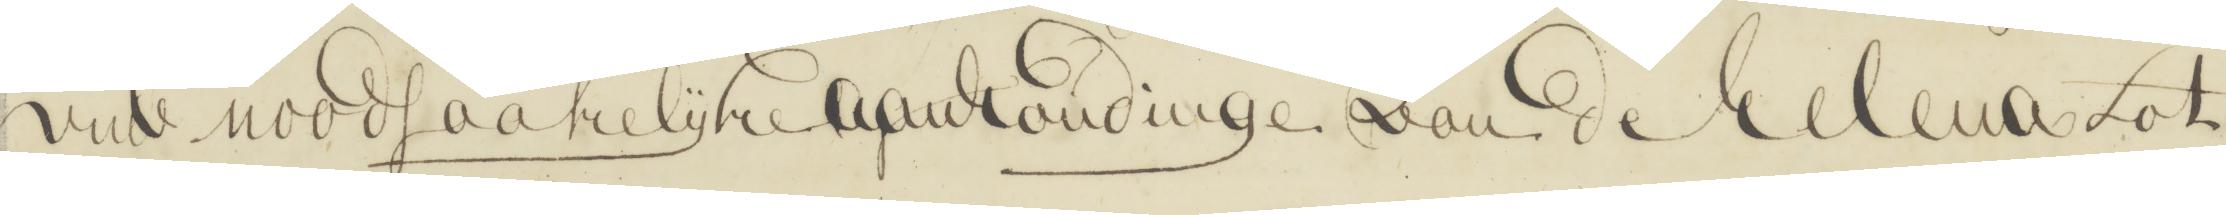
ende noodsaakelijke aanhoudinge van de helena tot
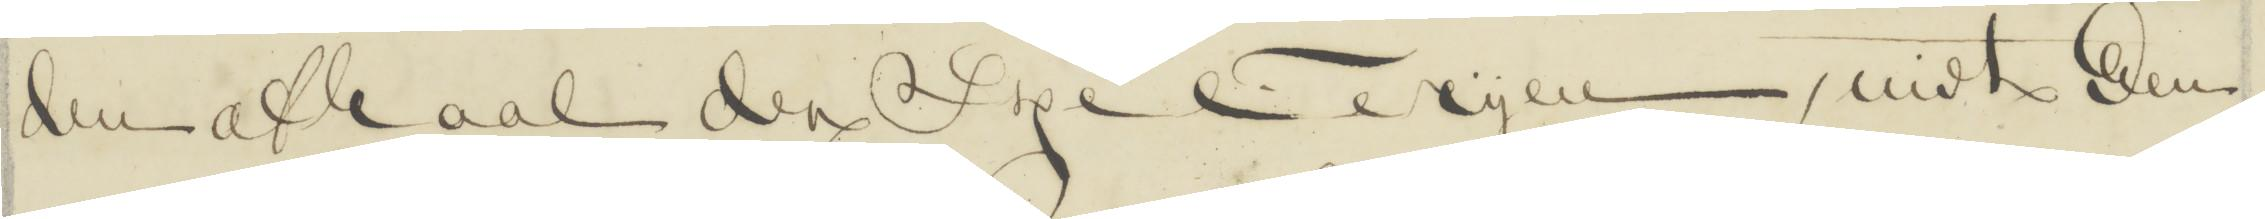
den afhaal der Specerijen, met den
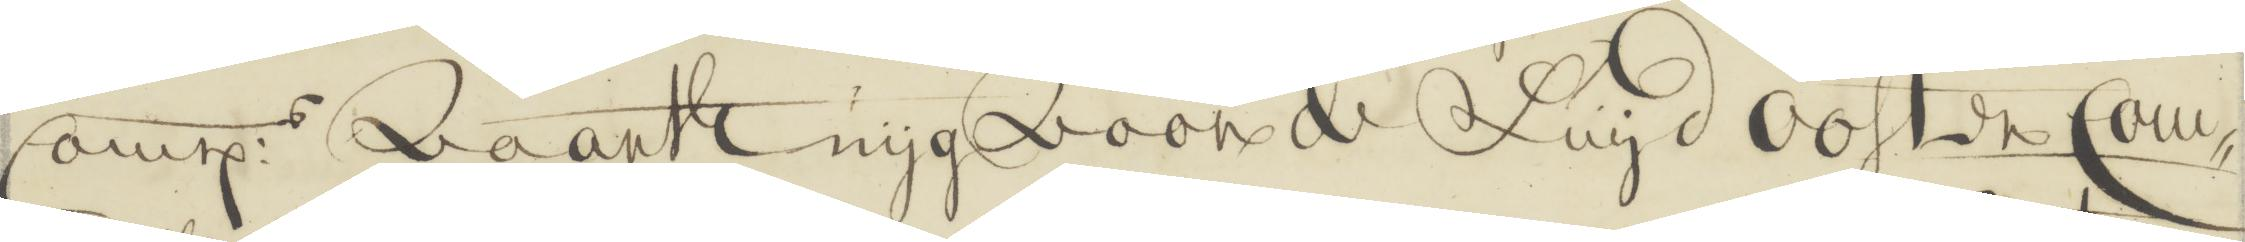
Comp:s vaarthuijg voor de Zuijd ooster Com„
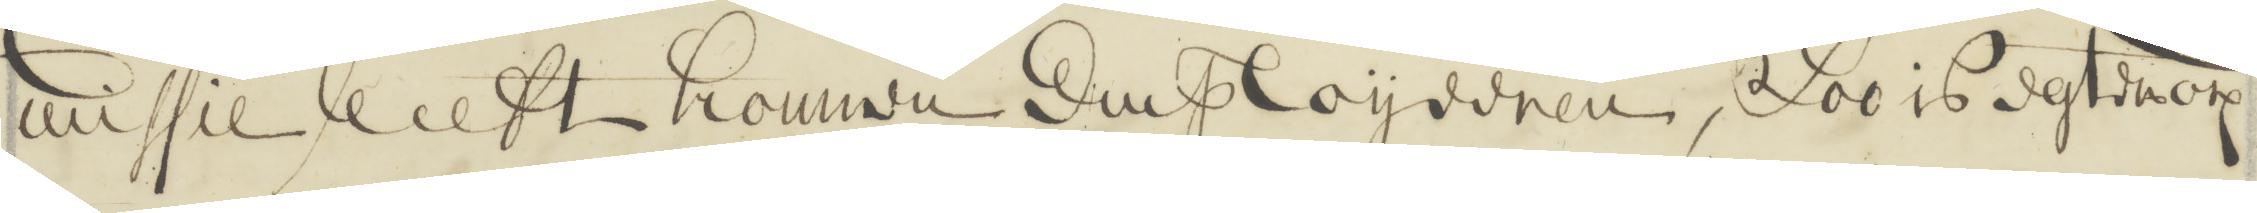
missie heeft konnen Emploijeeren, zoo is egter op
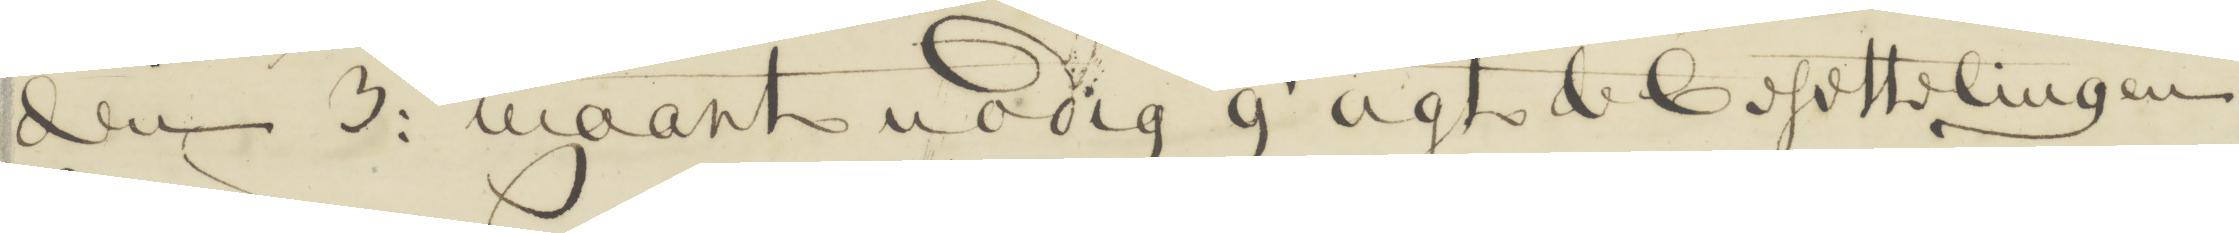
den 3: maart nodig g’agt de besettelingen
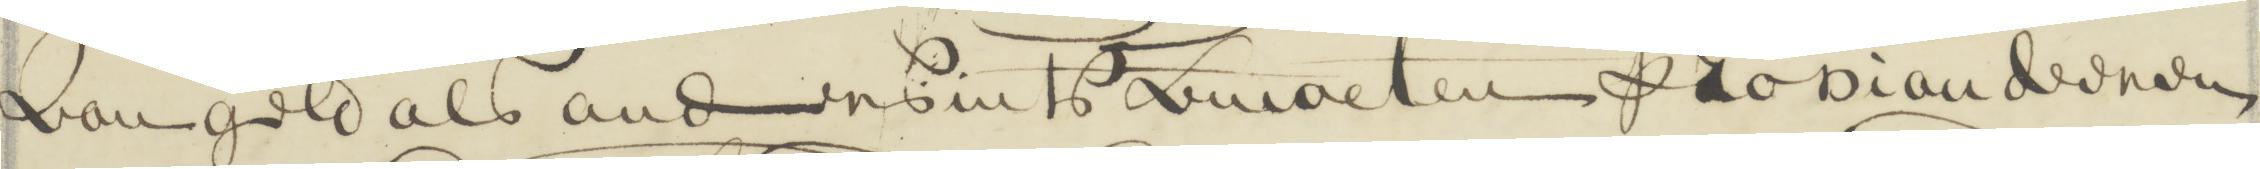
van geld als andersints temoeten proviandeeren,
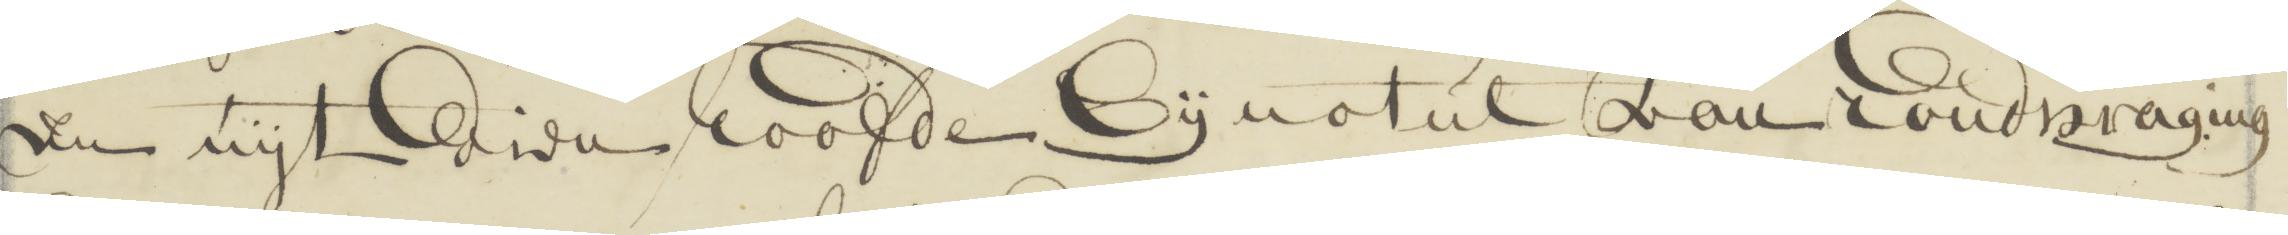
en uijt dien hoofde bij notul van rondvraging
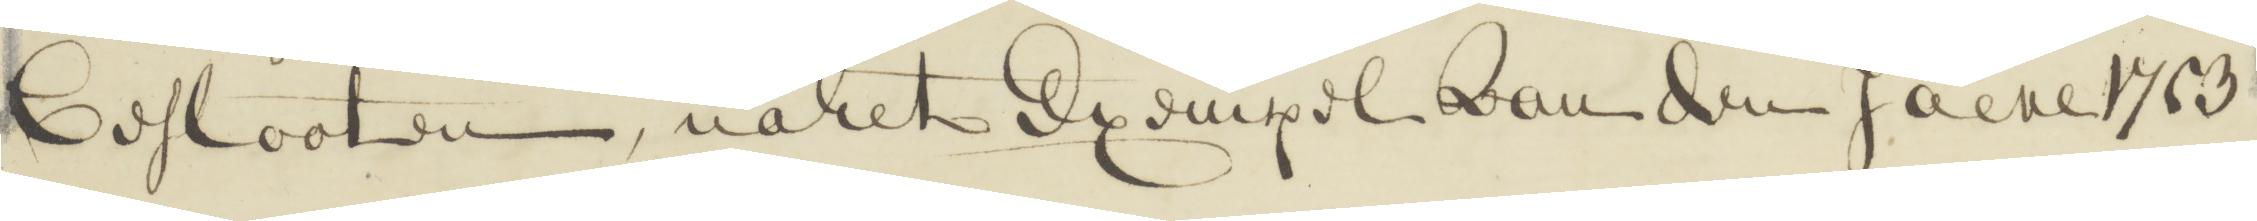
beslooten, na het Exempel van den Jaere 1753
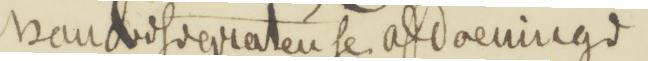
van dese grateuse afdoeninge
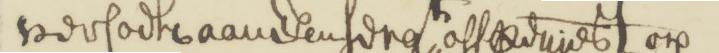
versoek aan Een serg„t off pennist op
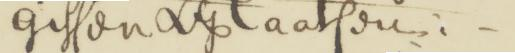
gissen teplaatsen:-
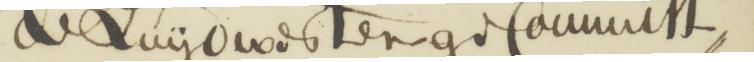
de Zuijdwester gecommitt„s
